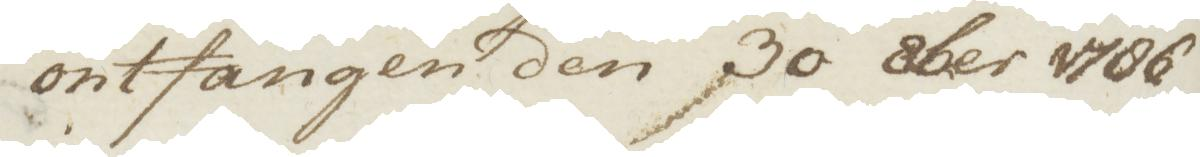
ontfangen den 30 8ber 1786
